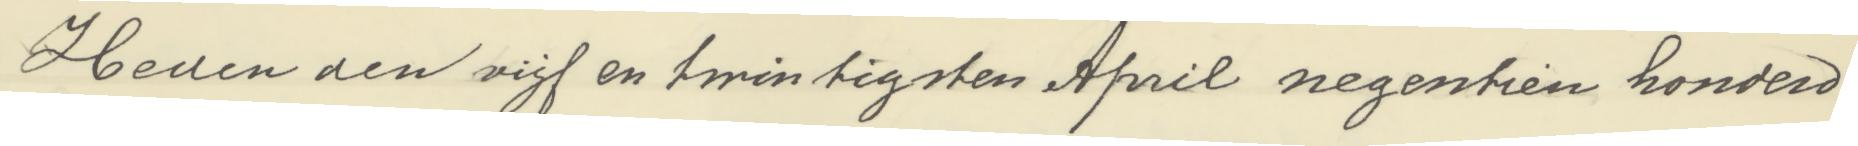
Heden den vijf en twintigsten April negentien honderd
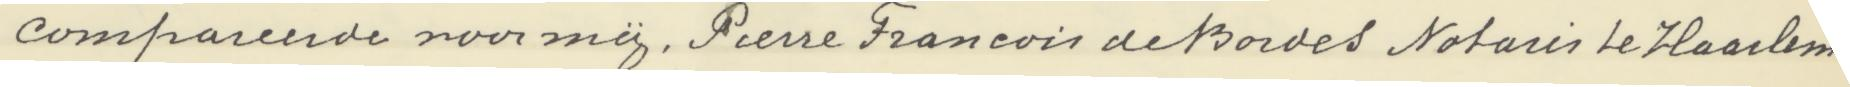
compareerde voor mij, Pierre Francois de Bordes Notaris te Haarlem
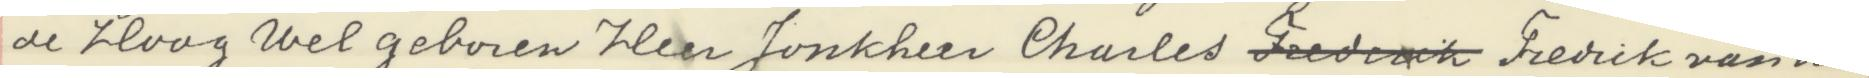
de Hoog Wel geboren Heer Jonkheer Charles Frederik Fredrik van de
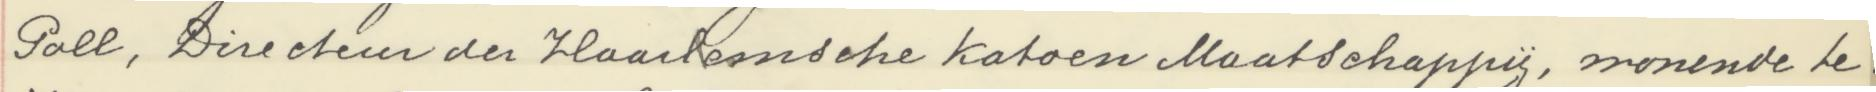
Poll, Directeur der Haarlemsche katoen Maatschappij, wonende te
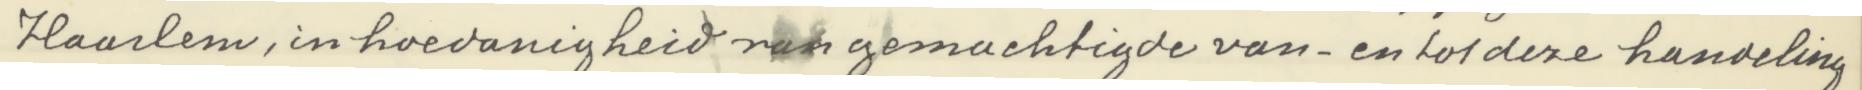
Haarlem, in hoedanigheid van gemachtigde van- en tot deze handeling
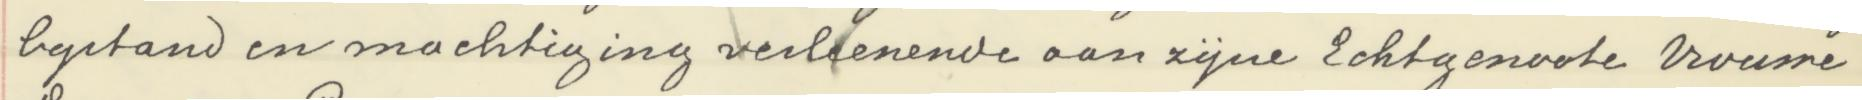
bystand en machtiging verleenende aan zijne Echtgenoote vrouwe
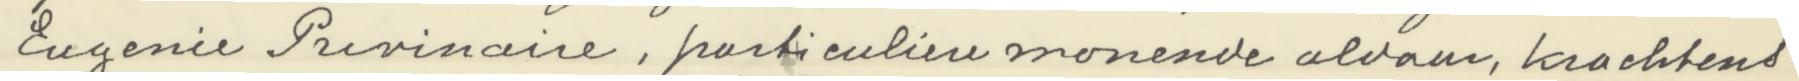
Eugenie Previnaire, particuliere wonende aldaar, krachtens
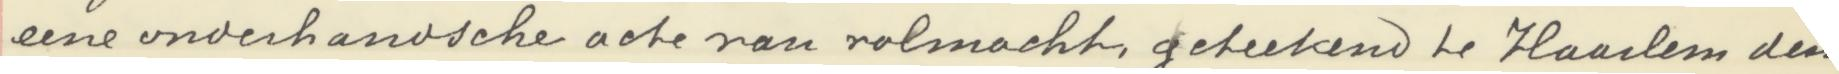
eene onderhandsche acte van volmacht, geteekend te Haarlem den
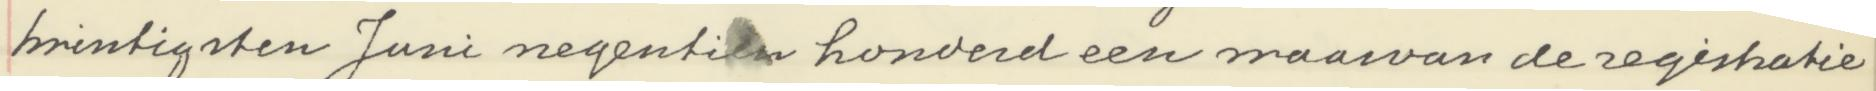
twintigsten Juni negentien honderd een waarvan de registratie
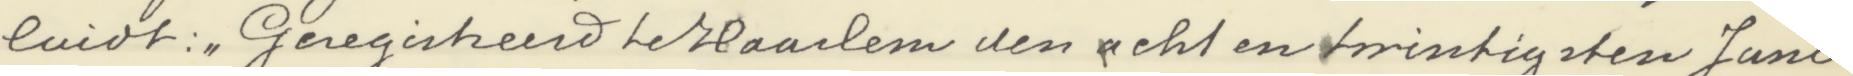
luidt: „Geregistreerd te Haarlem den acht en twintigsten Juni
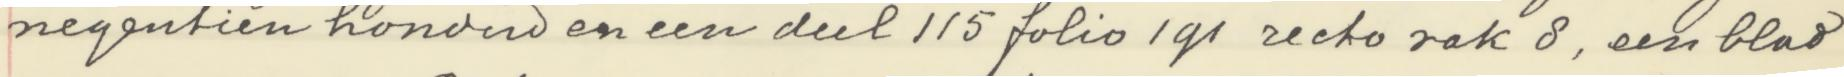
negentien honderd en een deel 115 folio 191 recto vak 8, een blad
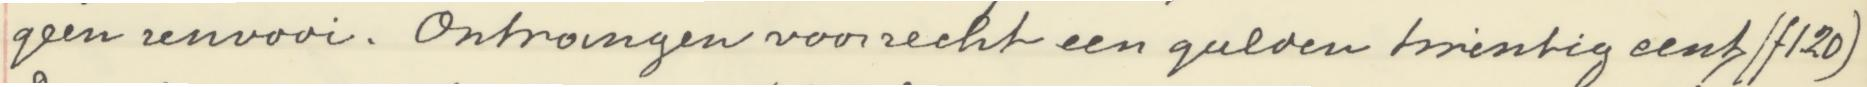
geen renvooi. Ontvangen voorrecht een gulden twintig cent (ƒ120)
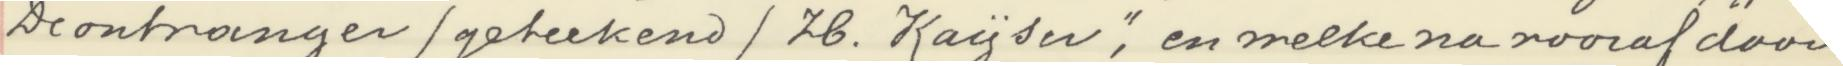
De ontvanger /geteekend/ H. Kaijser," en welke na vooraf door
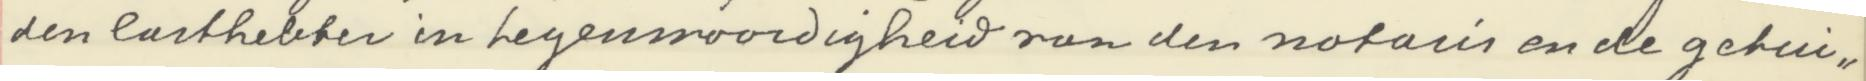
den lasthebber in tegenwoordigheid van den notaris en de getui„
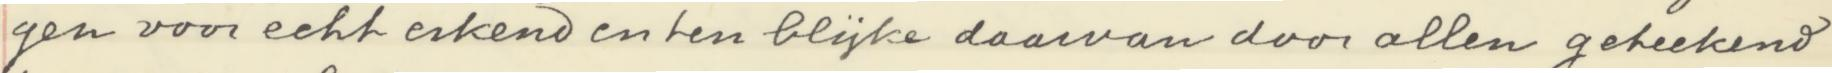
gen voor echt erkend en ten blijke daarvan door allen geteekend
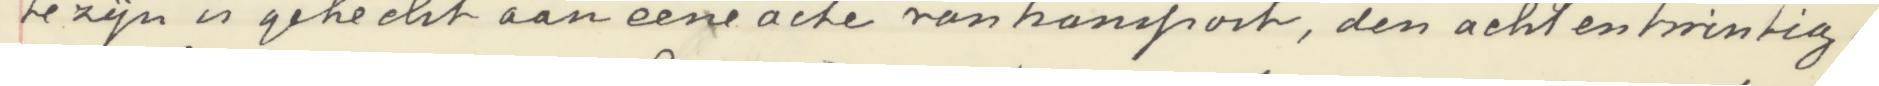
te zijn is gehecht aan eene acte van transport, den acht en twintig
